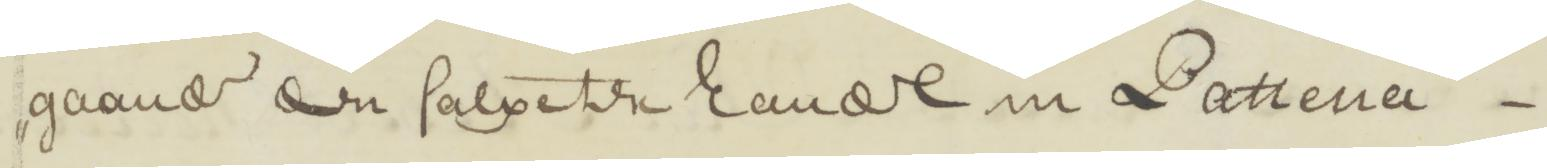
„gaande den salpeter handel in Pattena –
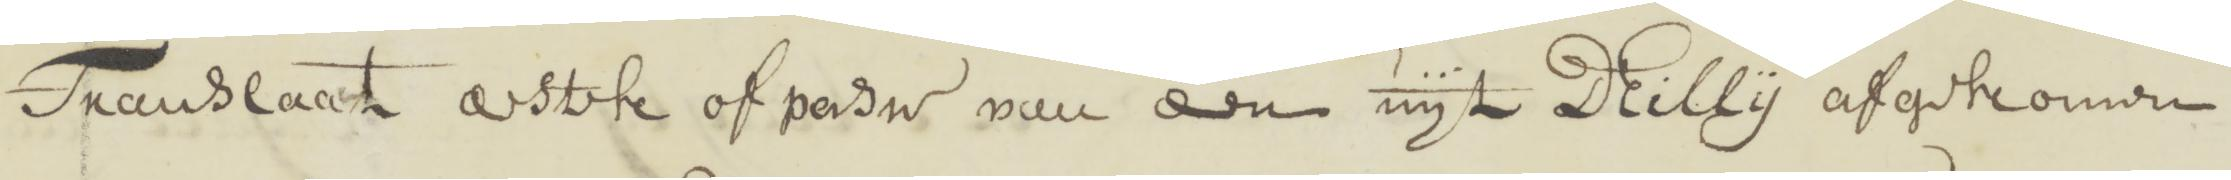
Translaat destek of padie ven den uijt Dhillij afgekomen
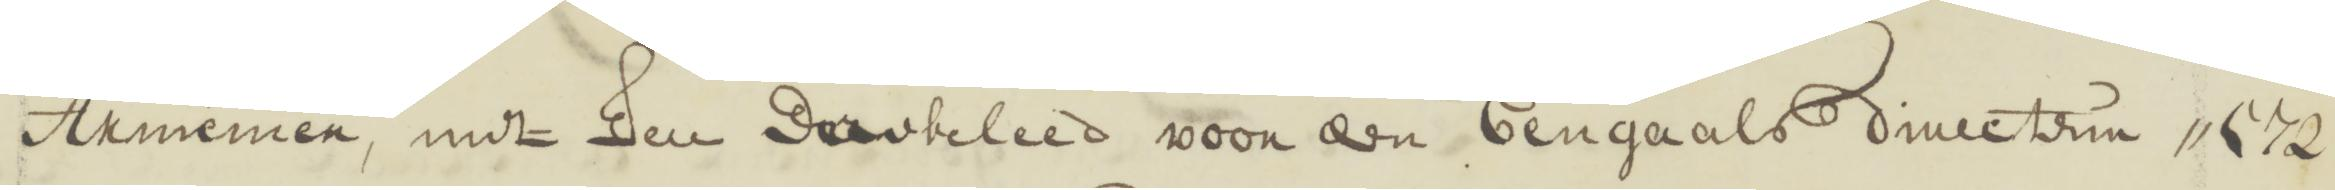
Armenier, met Een Erekleed voor den bengaals directeur „572
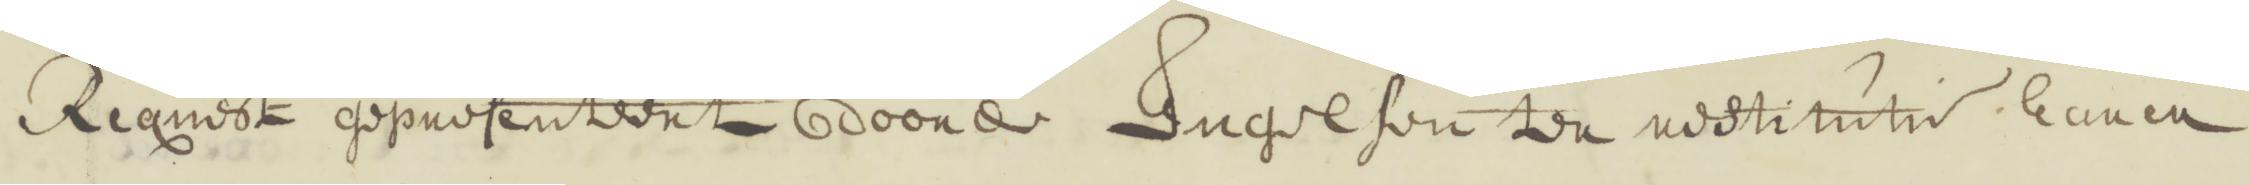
Request gepresenteert door de Engelsen ter restitutie harer
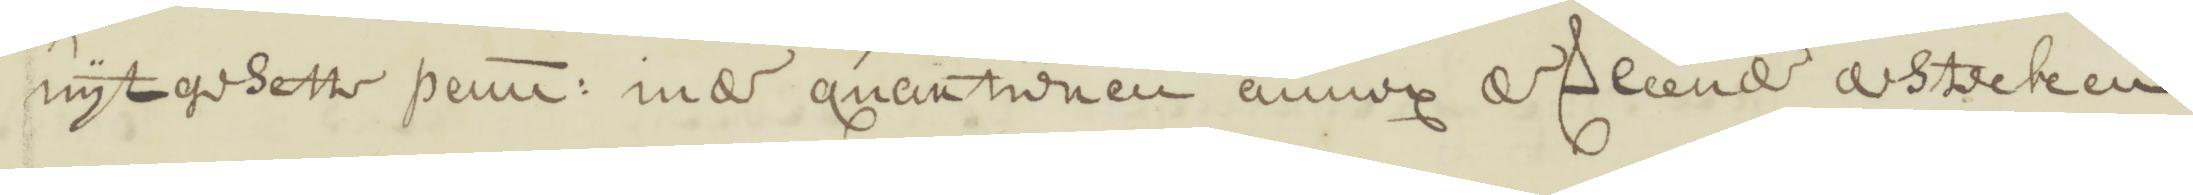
uijtgesette penn: in de quartieren annex de verleende destecken
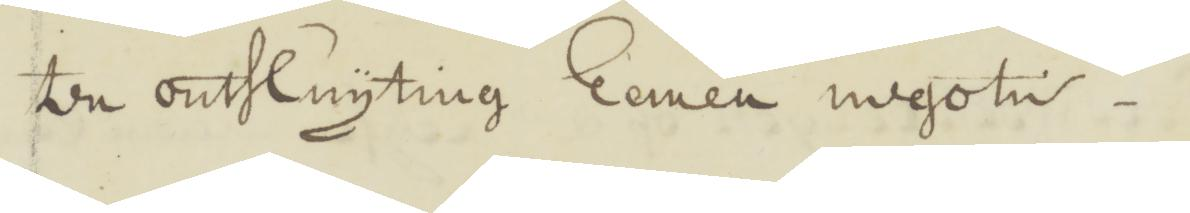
ter ontsluijting harer negotie –
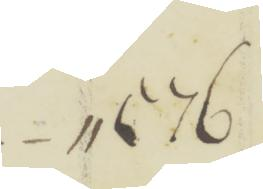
– „576
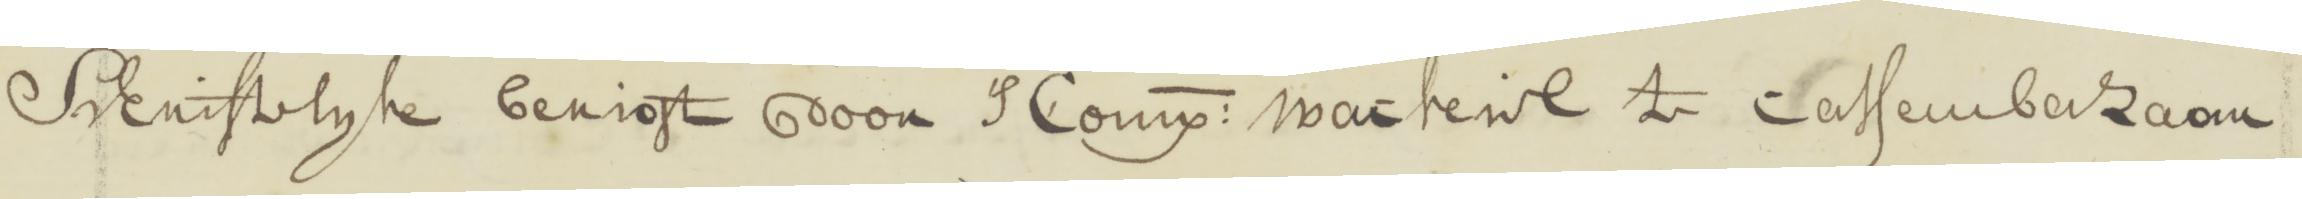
Schriftelyk berigt door ’s Comp: wackiel te Cassembazaar
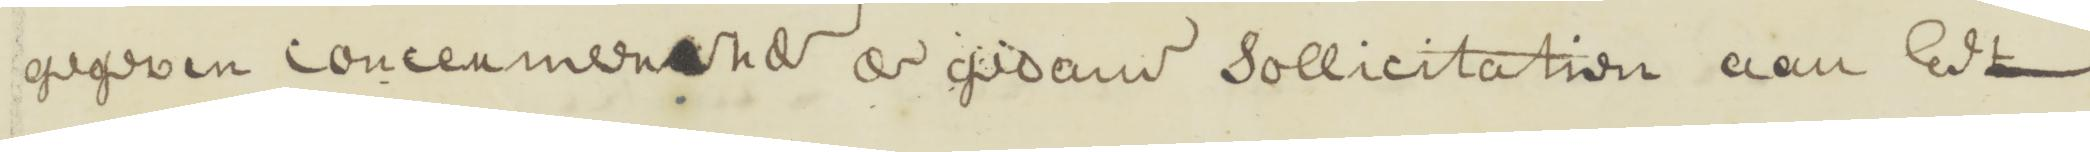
gegeven concerneerende de gedane sollicitatien aan het
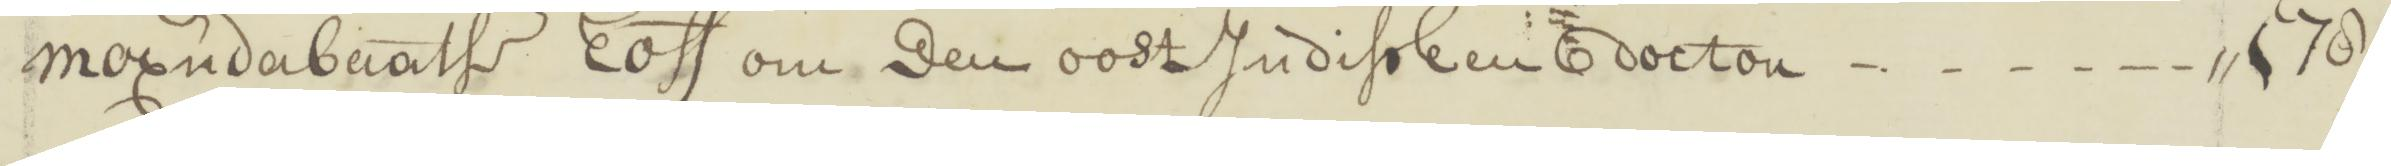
moxudabaatse hoff om Een oost Jndischen doctor – – – – – – „ 578
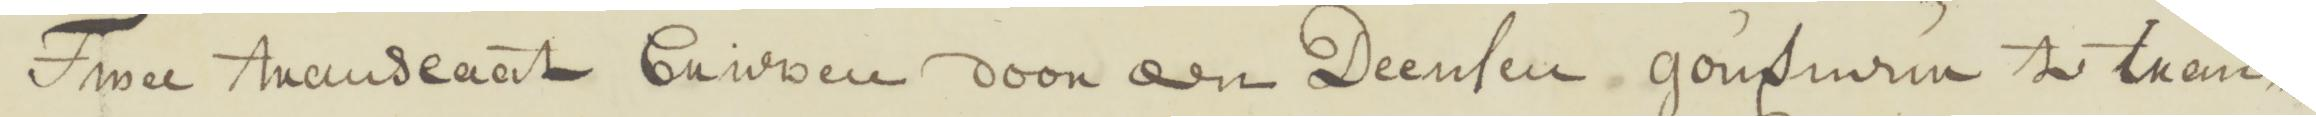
Twee translaat brieven door den Deensen gouverneur te tran„
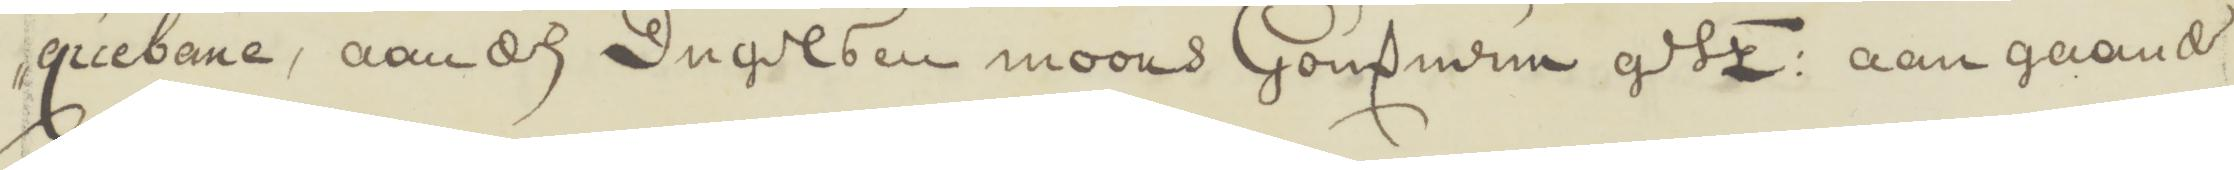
„quebare, aan den Engelsen moors Gouverneur gesz: aan gaande
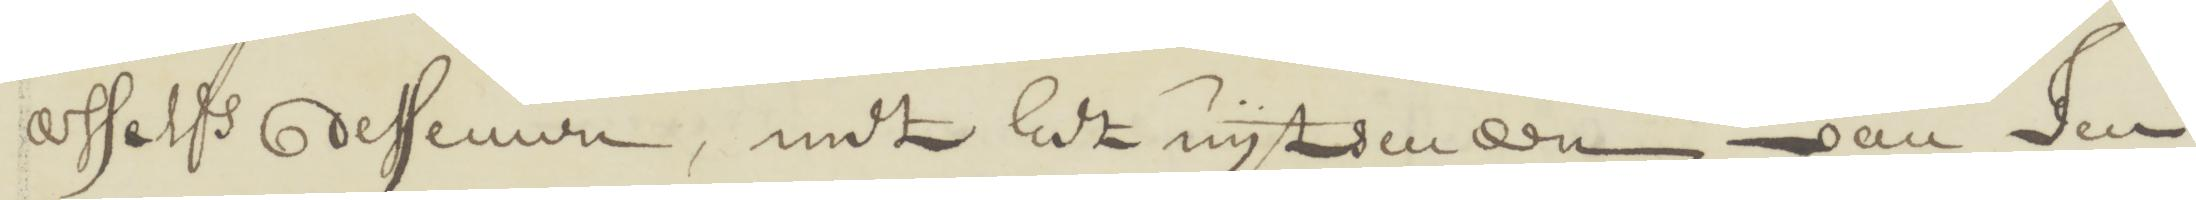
desselfs dessemen, met het uijtsenden van Een
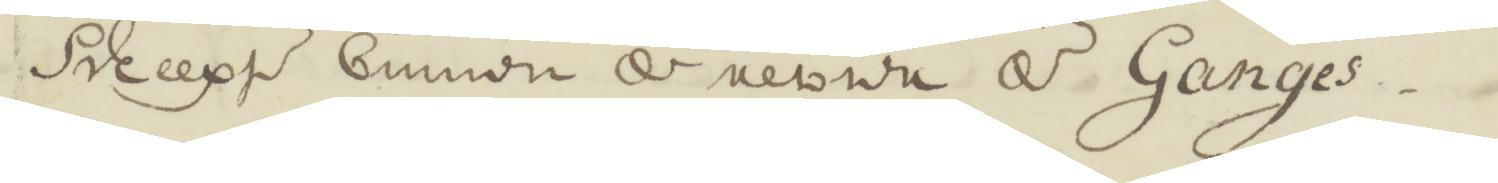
scheepje binnen de revier de Ganges –
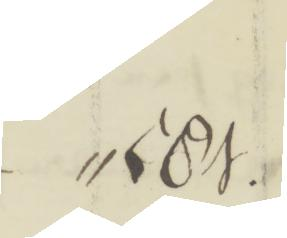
„581
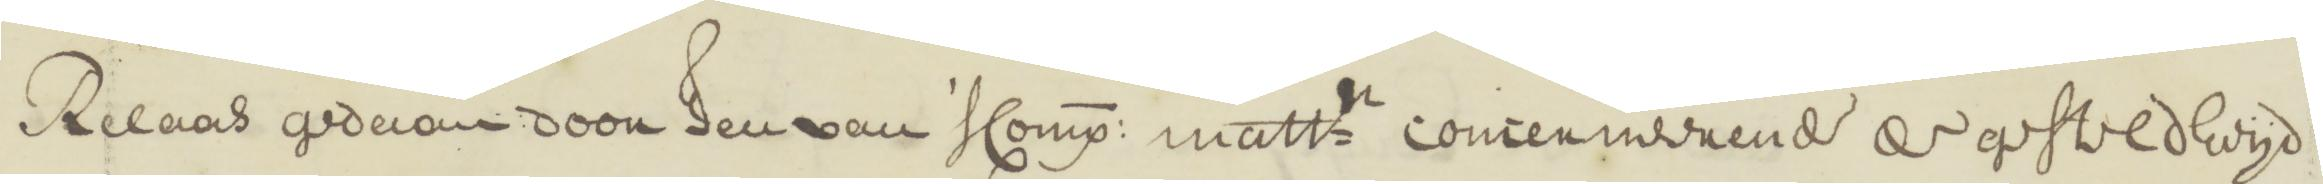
Relaas gedaan door Een van 'sComp: matt=n concerneerende de gesteldheijd
